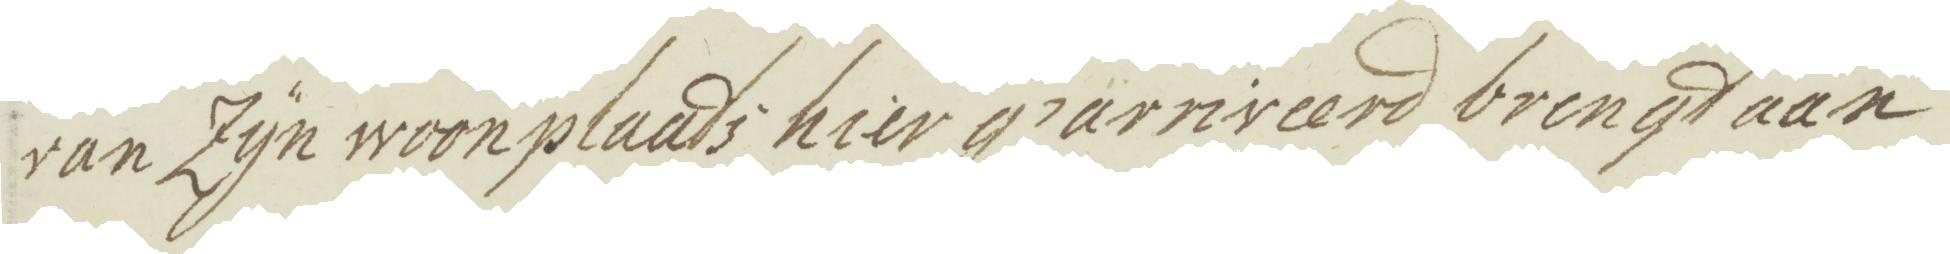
van Zijn woonplaats hier g'arriveerd brengt aan
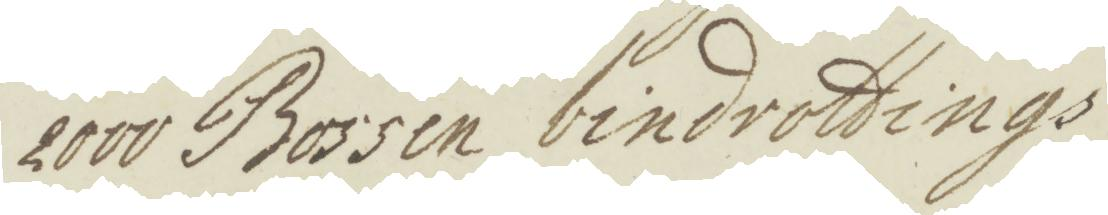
2000 Bossen bindrottings
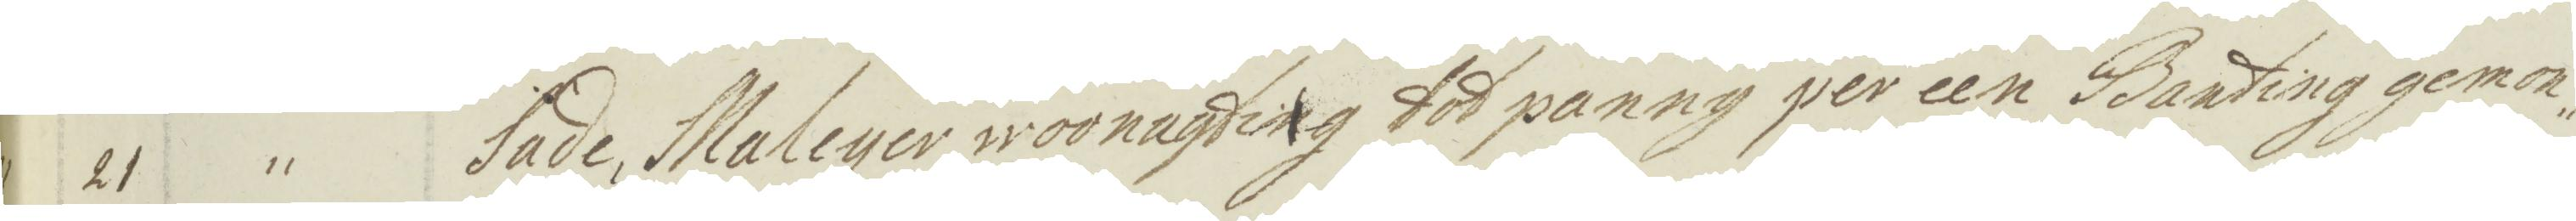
„ 21 „ Sade, Maleyer woonagting tot pannij per een Barting gemon„
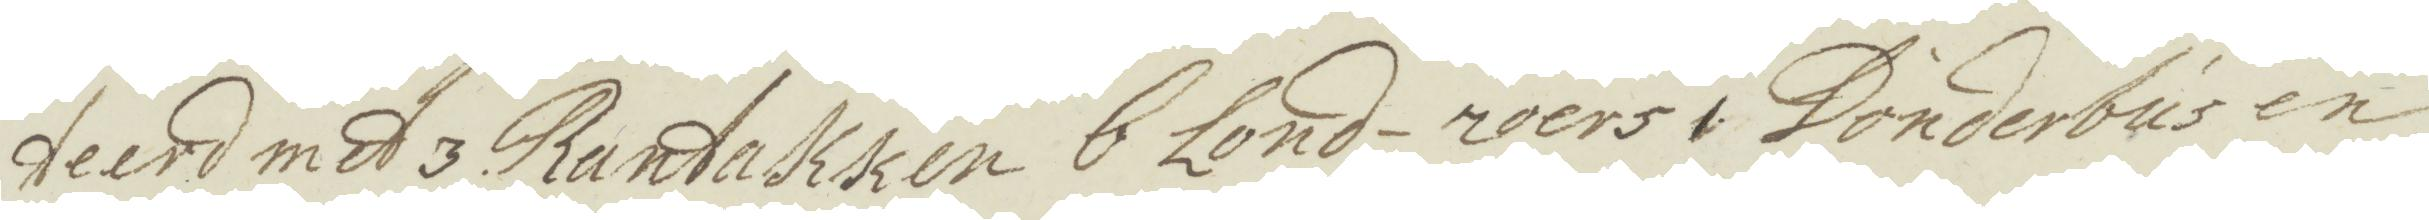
teerd met 3 Rantakken 6 lond-roers 1 Donderbus en
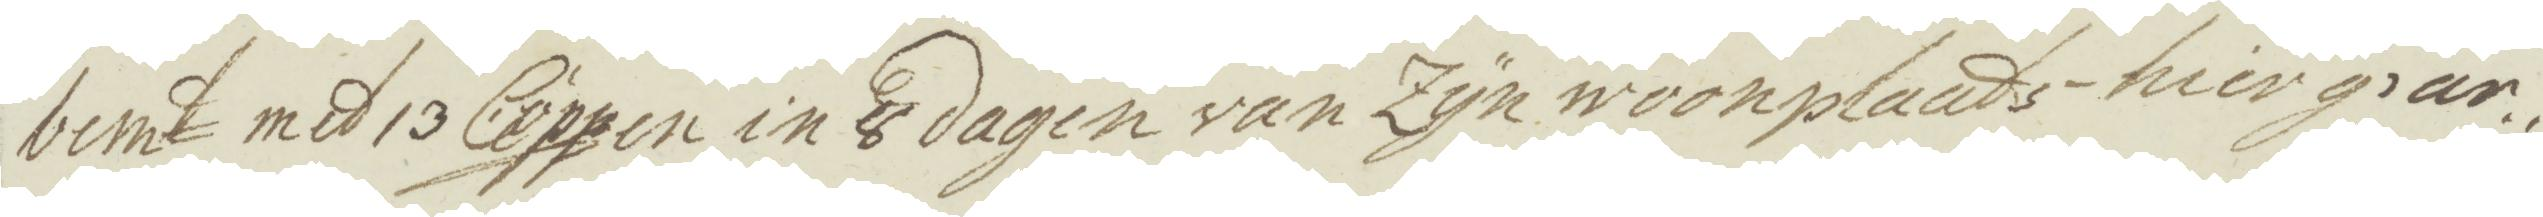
bem=t met 13 Coppen in 8 dagen van zZjn woonplaats-hier g'ar„
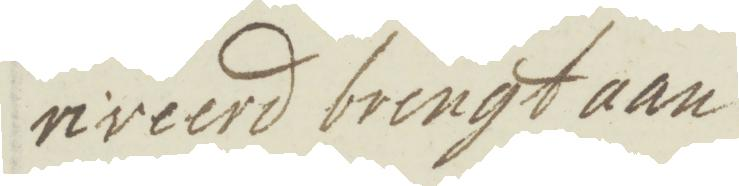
riveerd brengt aan
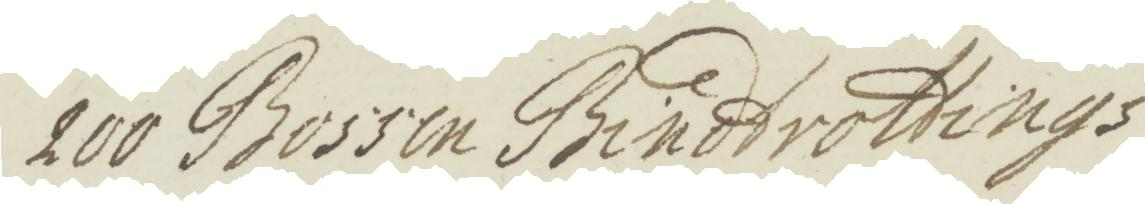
200 Bossen Bindtrottings
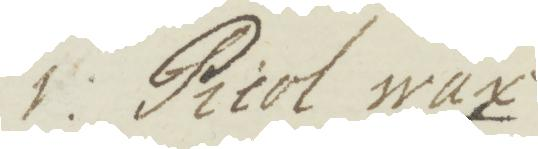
1: Picol wax
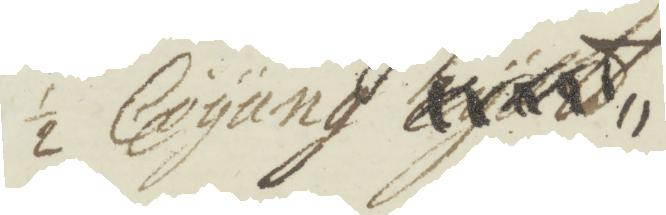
½ Coijang rijsts
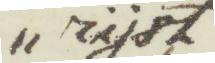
„rijst
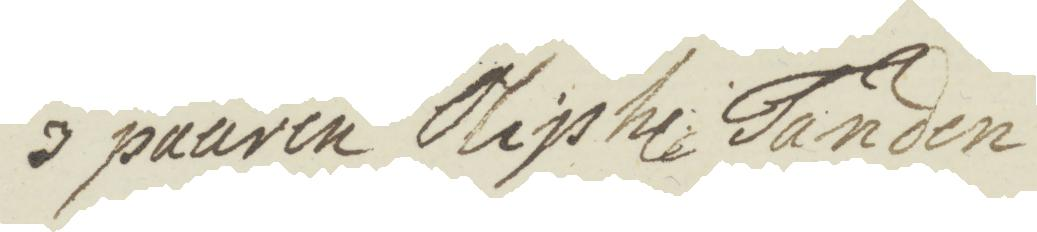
3 paaren Oliph: Tanden
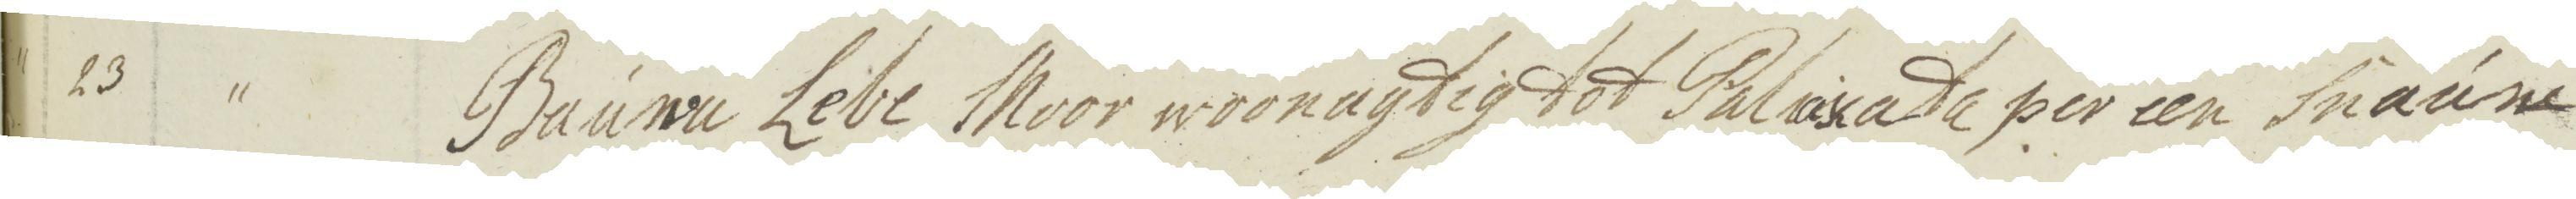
„ 23 „ Bauwa Lebe Moor woonagtig tot Palarata per een snauw
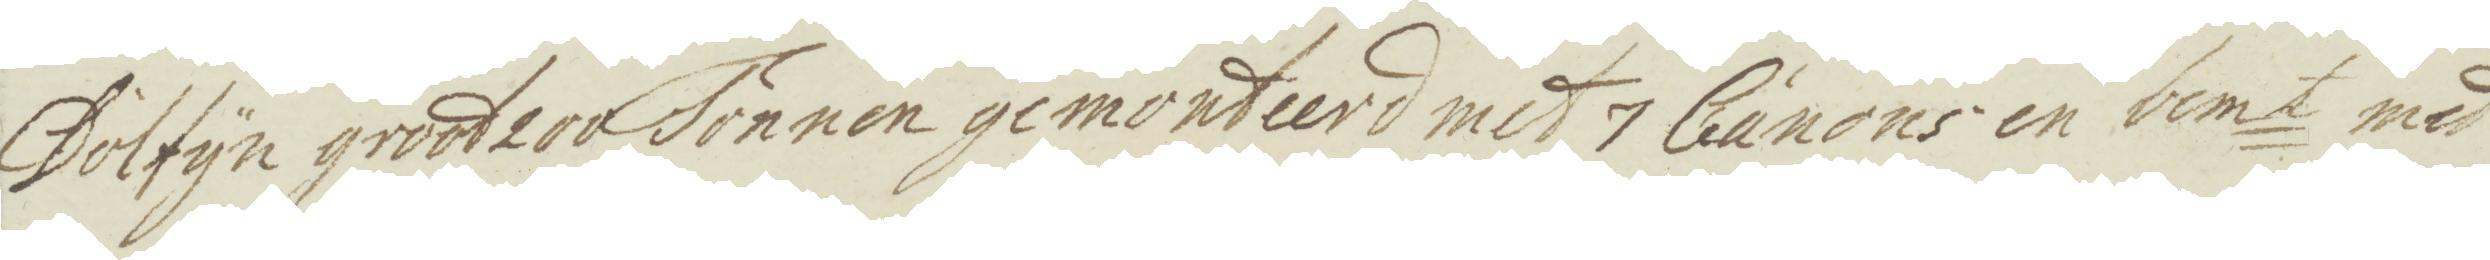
Dolfijn groot 200 Tonnen gemonteerd met 7 Canons en bem=t met
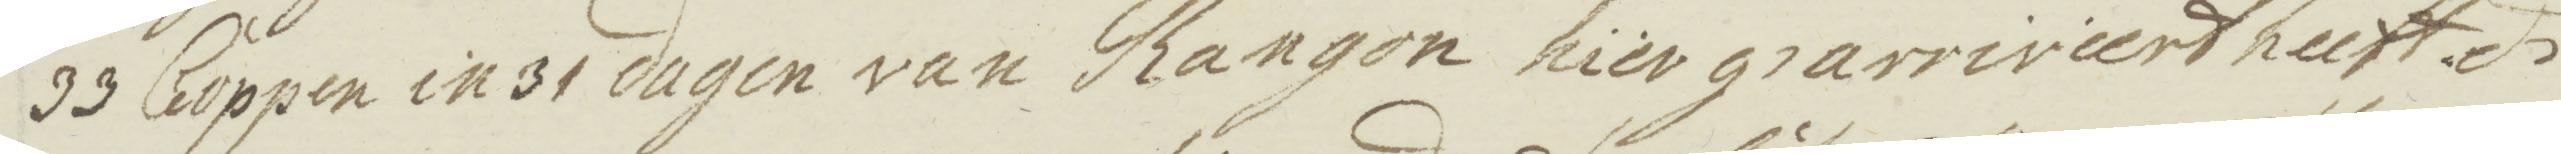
33 Coppen in 31 dagen van Rangon hier g'arriveert heeft d'
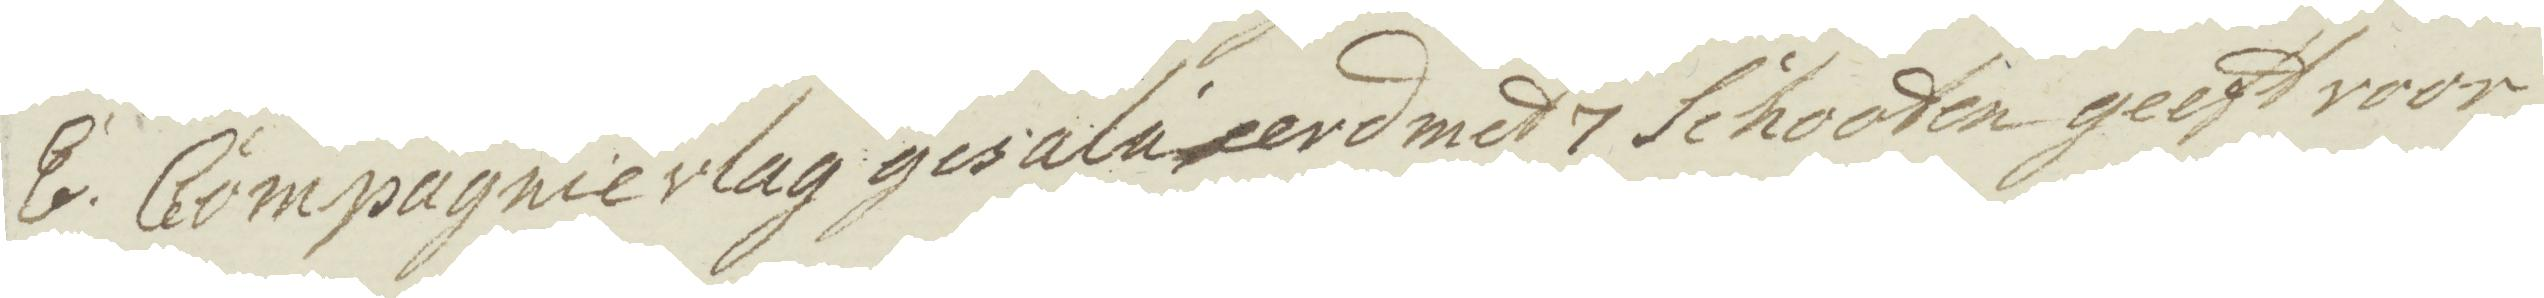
E. Compagnie vlag gesalueerd met 7 schooten geeft voor
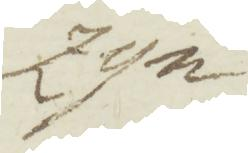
Zyn
